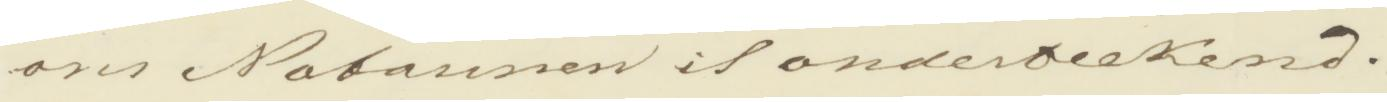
ons Notarissen is onderteekend.
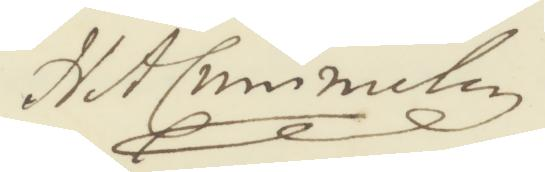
H A Crommelin
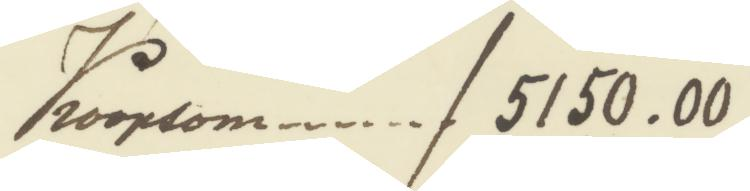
Koopsom - - - - - - ƒ 5150.00
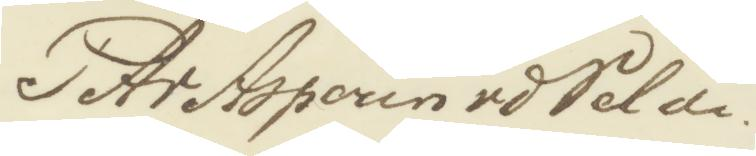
P Ar Asperen vd Velde.
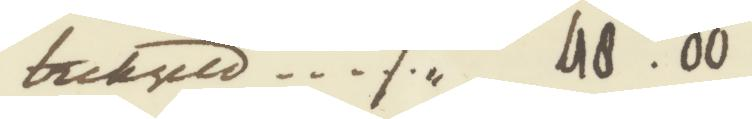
trekgeld - - - . . „ 48 . 00
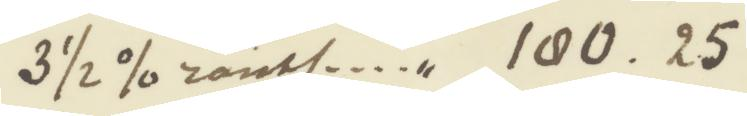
3½ % rants - - - - „ 180 . 25
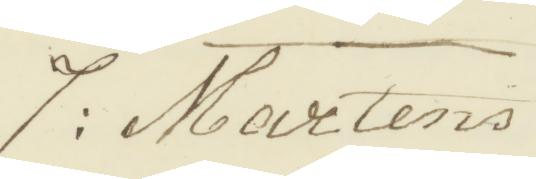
J: Martens
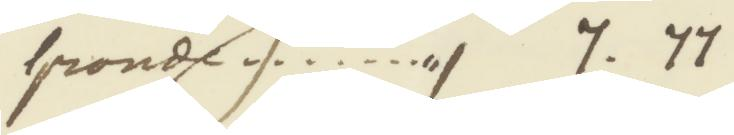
Gronde - - . . - - . „ 7. 77
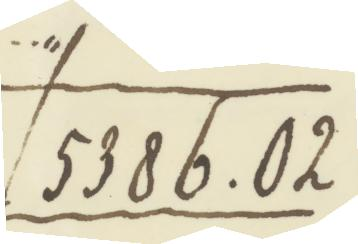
ƒ 5386.02
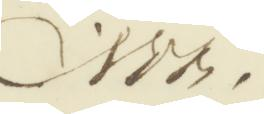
Not,
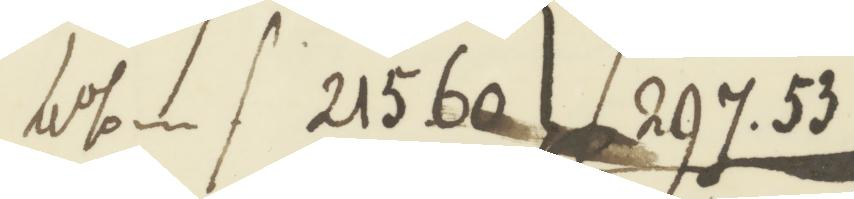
4% — ƒ 215.60 ƒ297.53
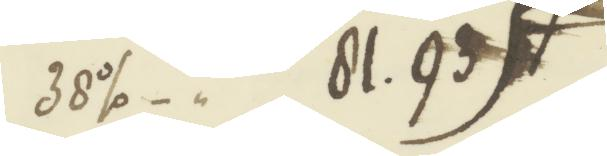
38% - „ 81.93
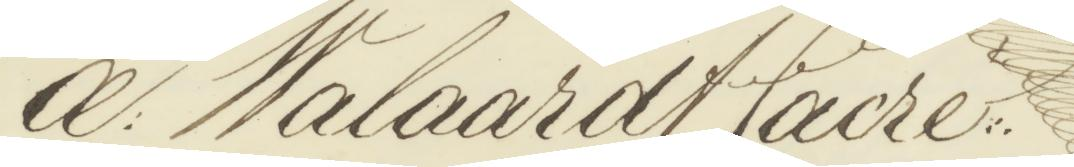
ae: Walaardt Sacré:.
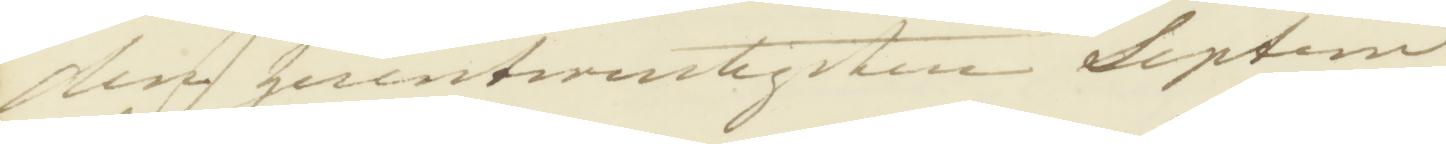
den Zesentwintigsten Septem
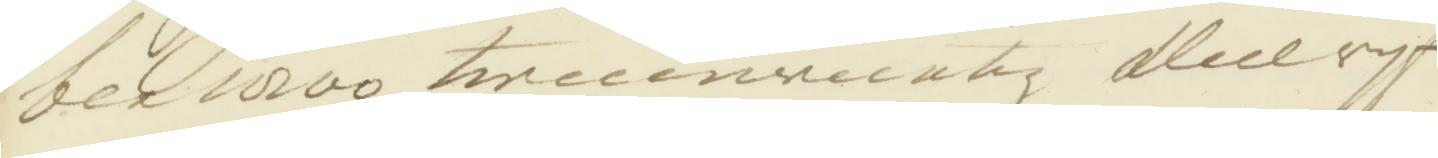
ber 1800 tweeenveertig Deel vyf
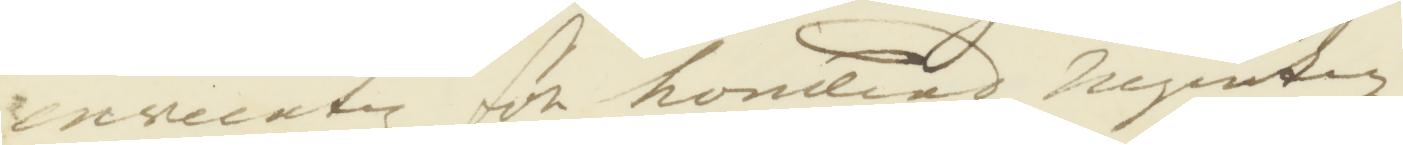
en veertig fol. honderd negentig
